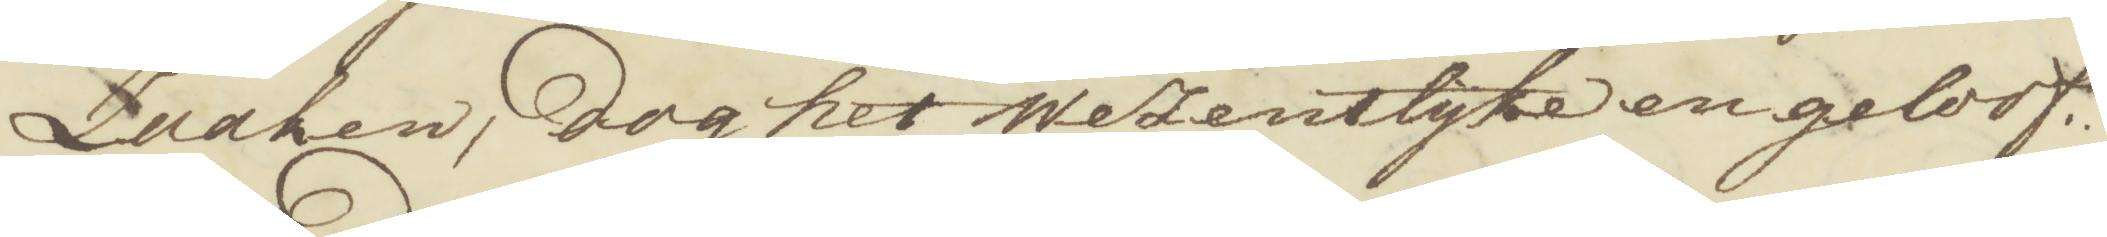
zaaken, dog het wezentlijke en geloof„
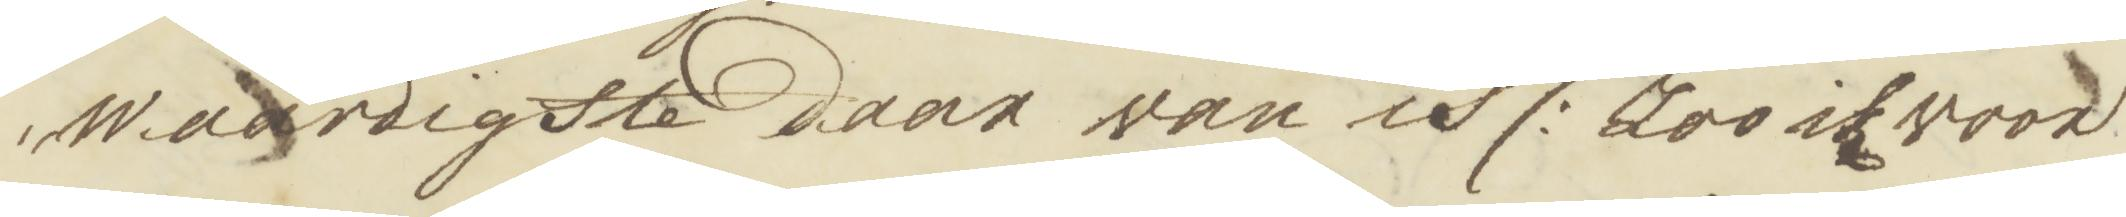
„waardigste daar van is (:zoo ik voor
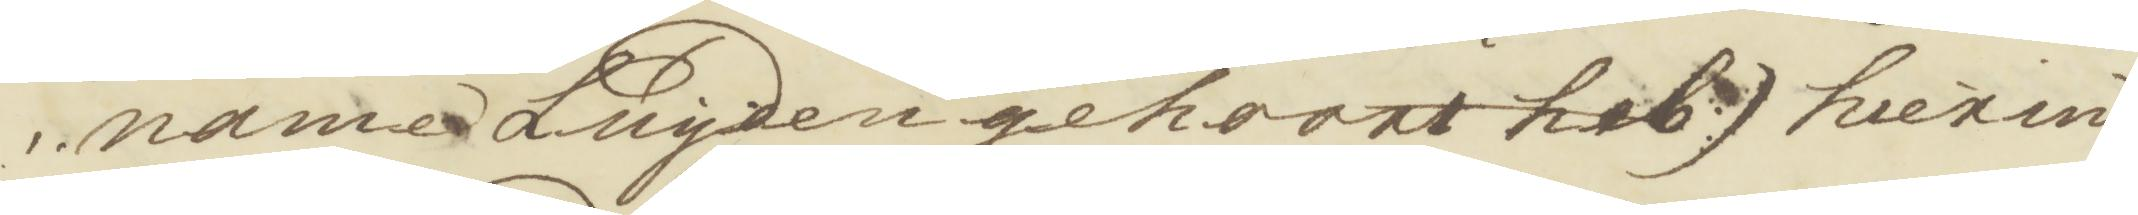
„name Luijden gehoort heb:) hierin
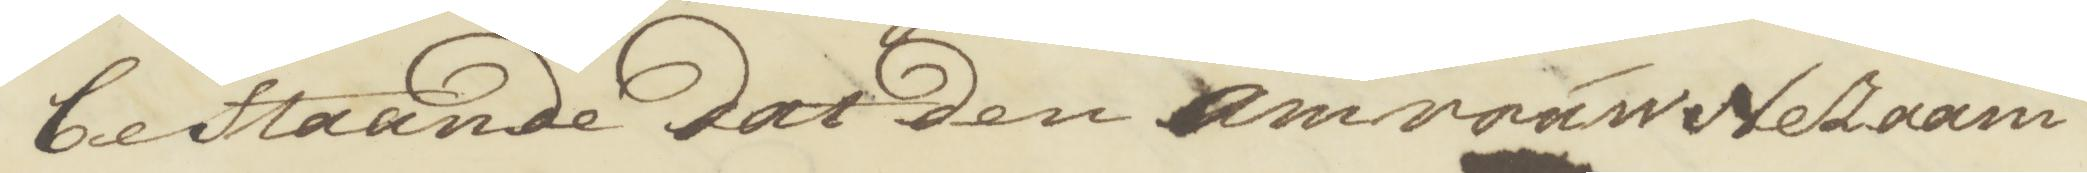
bestaande dat den amrouw Nezaam
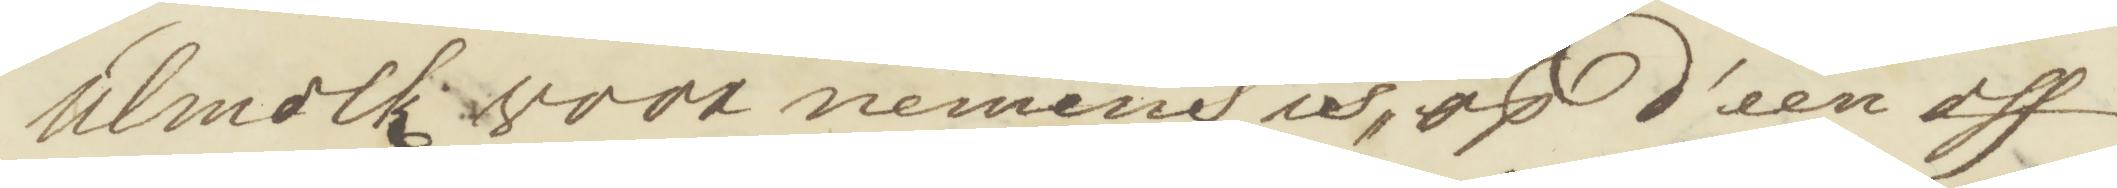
ulmolk voor nemens is „ op d’een off
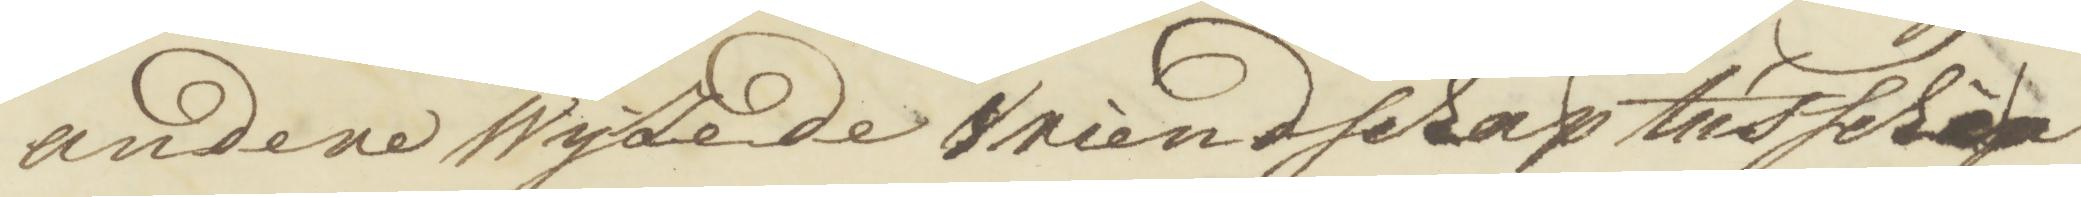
andere wijze de vriendschap tusschen
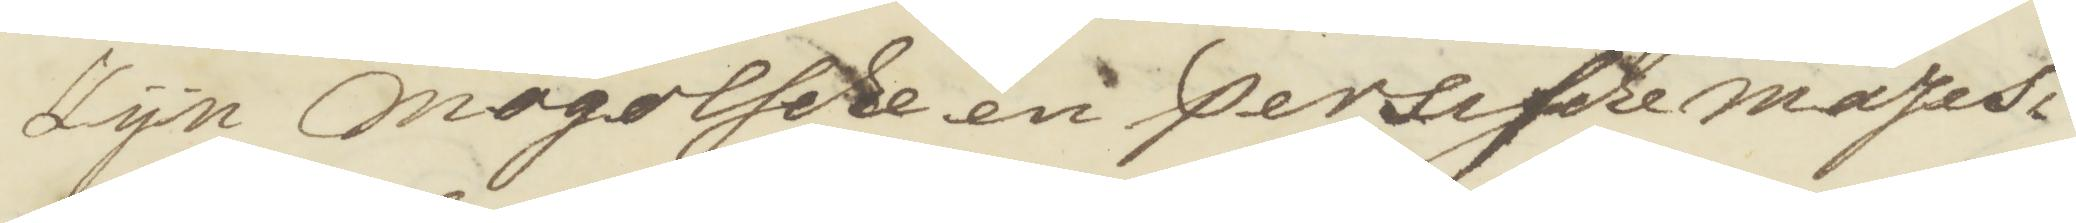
zijn mogolsche en persische majes„
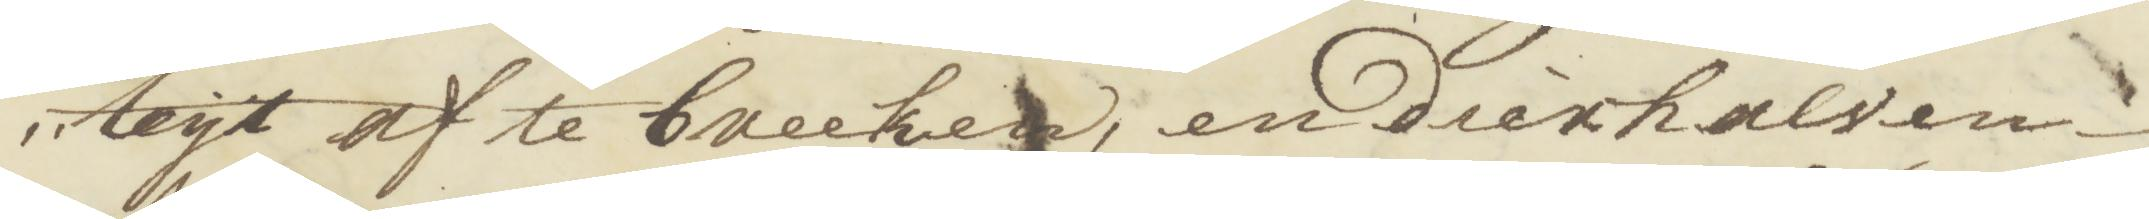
„teijt af te breeken; en dierhalven.
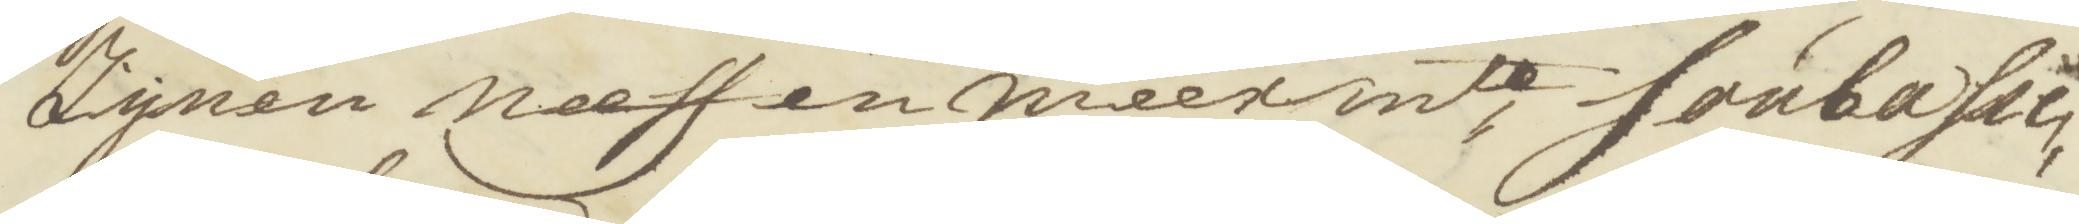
zijnen neeff en meer m„te soubaste„
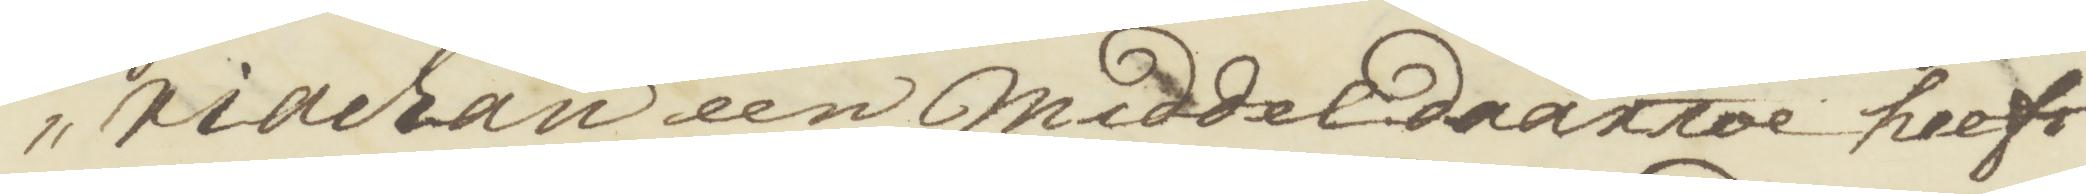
„riachan een middel daartoe heeft
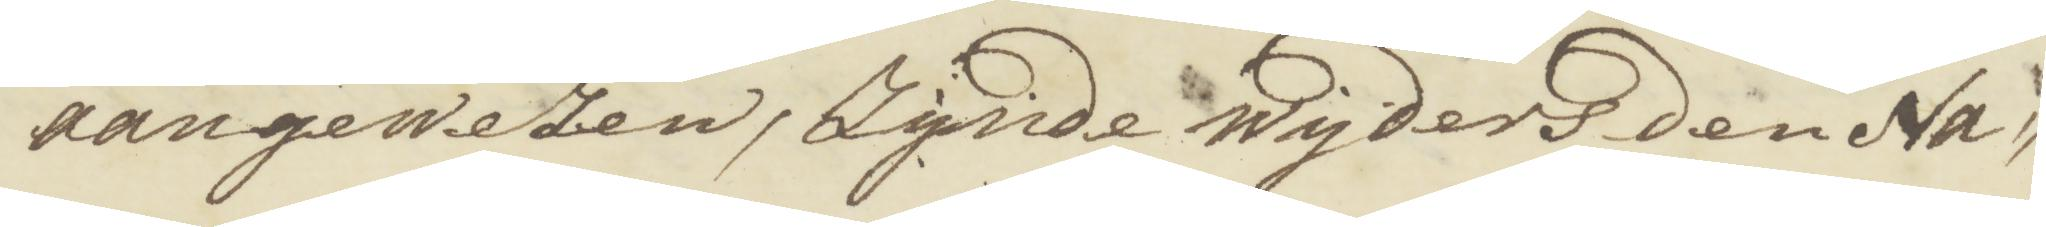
aangewezen, zijnde wijders den Na„
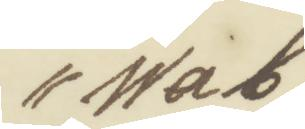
„wab
